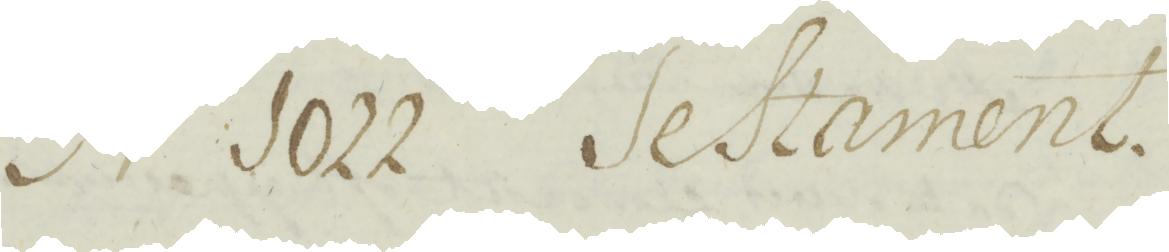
N:o 1022 Testament.
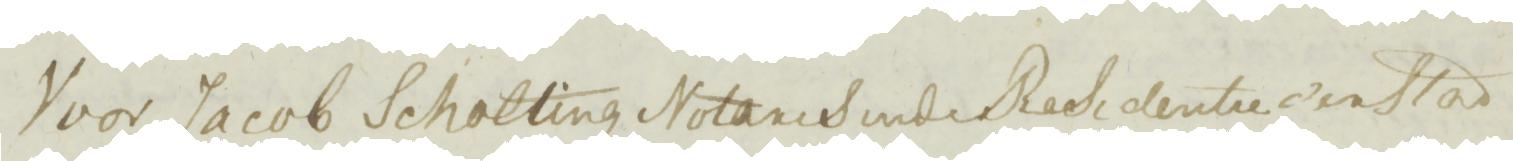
Voor Jacob Scholting Notaris inde Residentie der stad
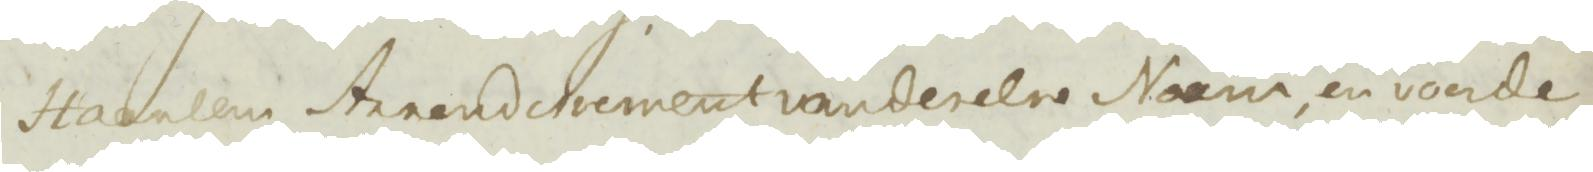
Haarlem Arrondissement van dezelve Naam, en voor de
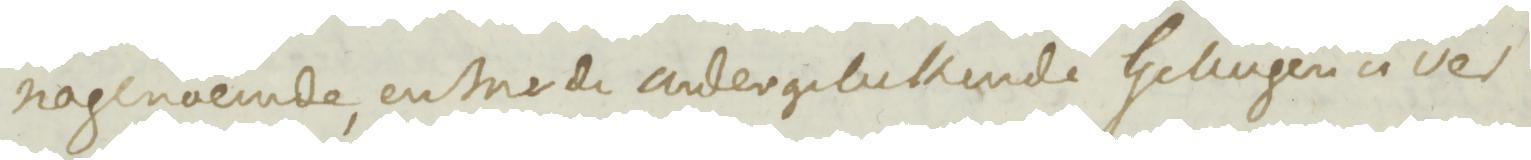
nagenoemde, en mede ondergetekende Getuigen is ver
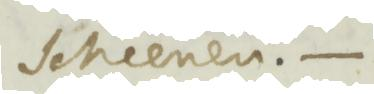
scheenen.-
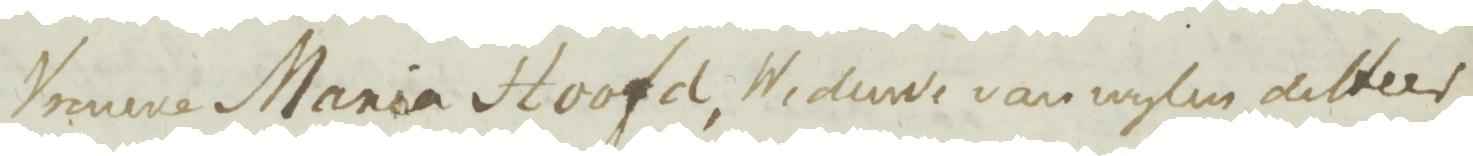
Vrouwe Maria Hoofd, Weduwe van wylen deHeer
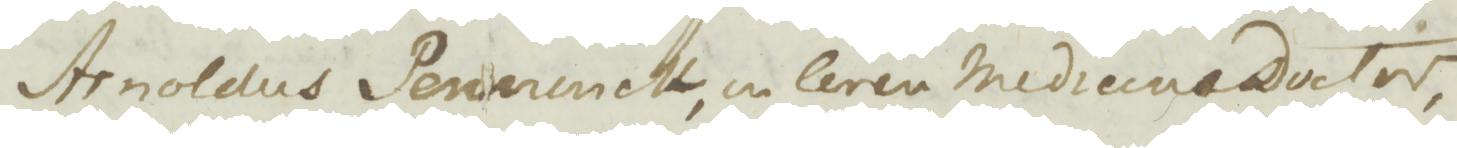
Arnoldus Penninck, in leven medicyneDocter,
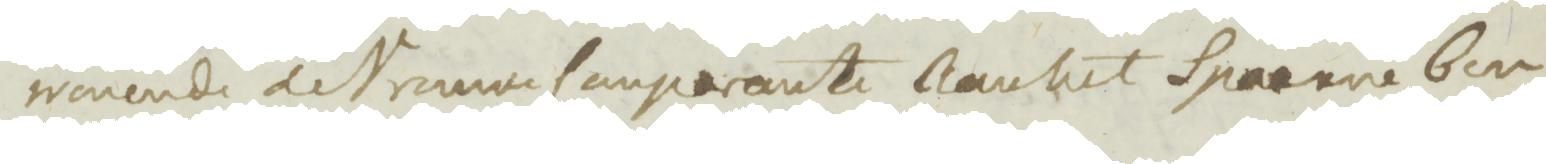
wonende de Vrouwe Comparante aan het Spaarne bin
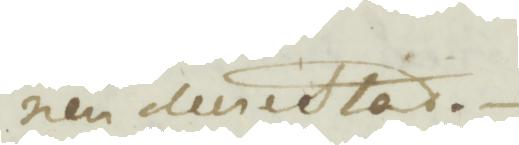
nen deeseStad.
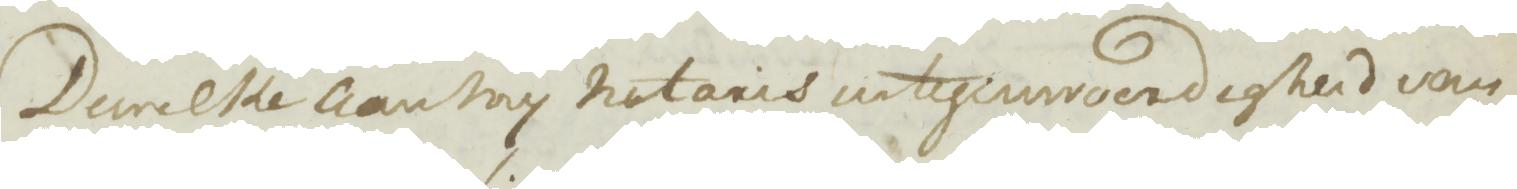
Dewelske aan my notaris integenwoordigheid van
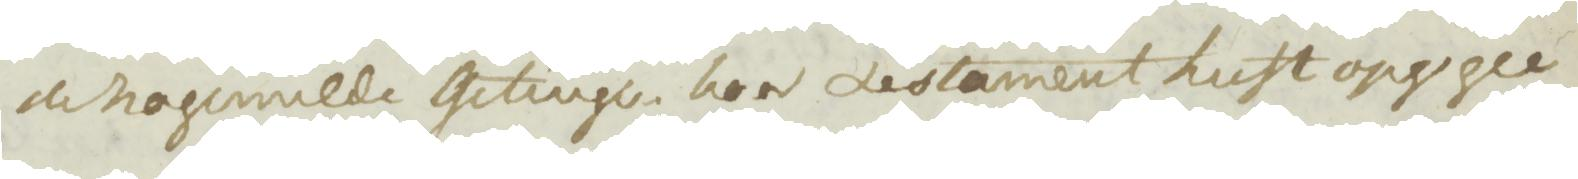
de nagemelde getuigen haar Testament heeft opgegee
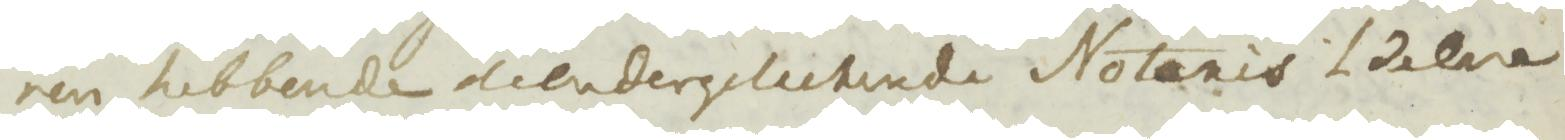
ven, hebbende deOndergeteekende Notaris ’tzelve
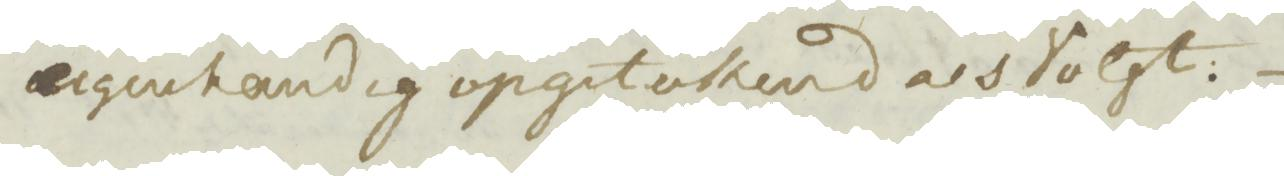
eigenhandig opgetekend als Volgt:-
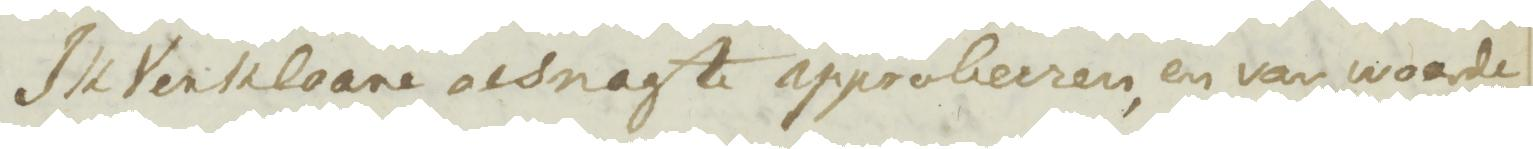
Ik Verklaare alsnogte approberen, en van waarde
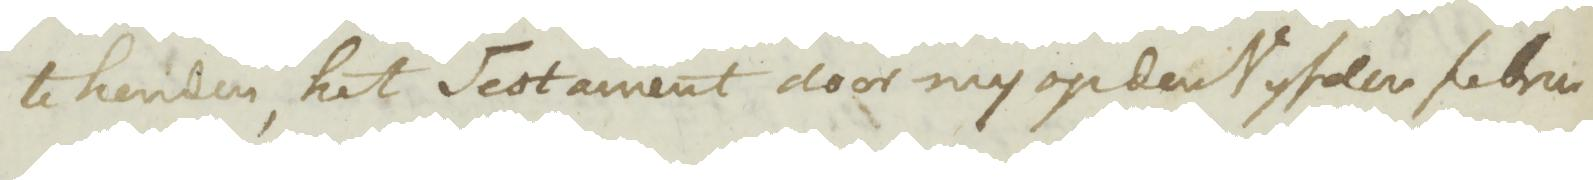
te houden het Testament door my op denVijfden febru
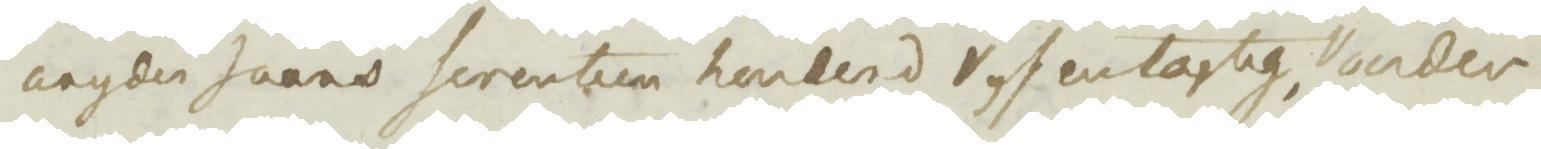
arydes Jaars Seventien honderd vyfentagtig, voorder
